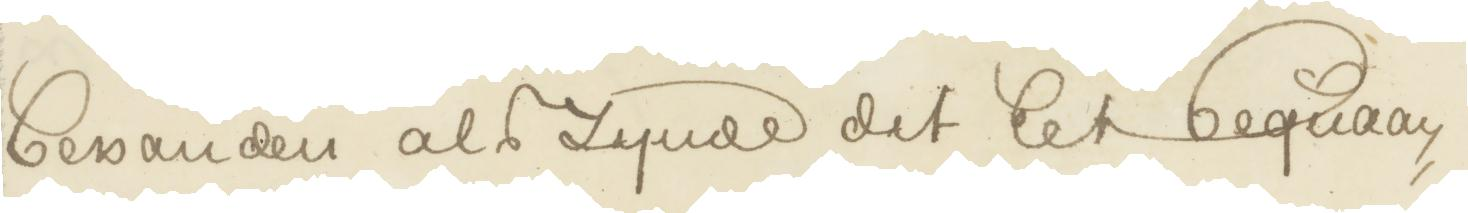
bevanden als zynde dit het bequaan„
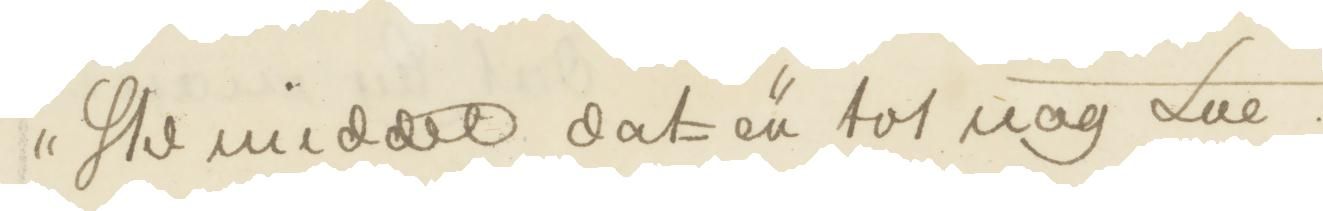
„ste middel dat er tot nog toe
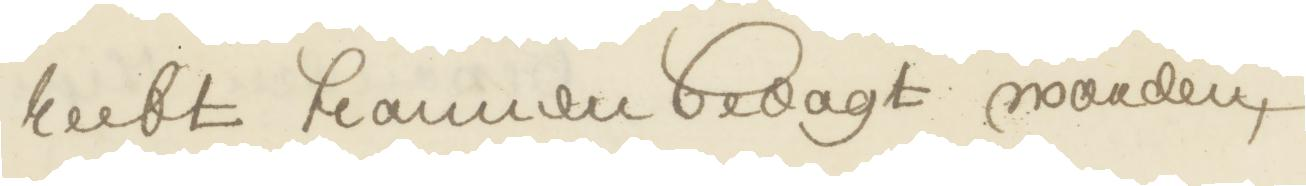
heeft kannen bedagt worden,
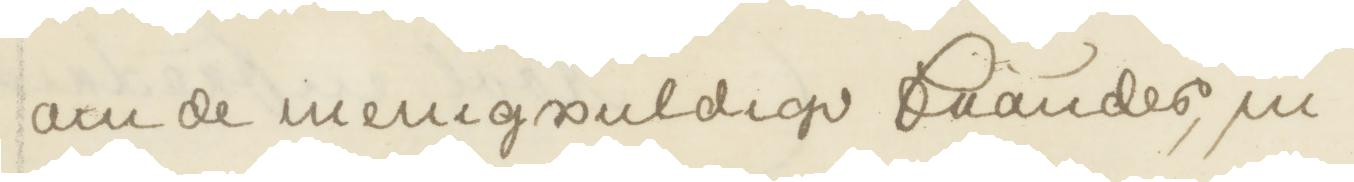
am de menigvuldige fraudes, in
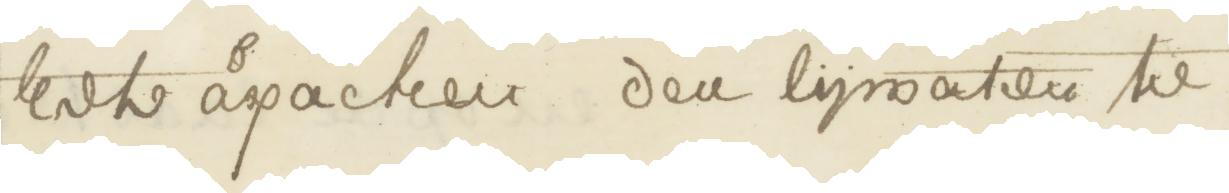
hete afpacken den lijwaten te
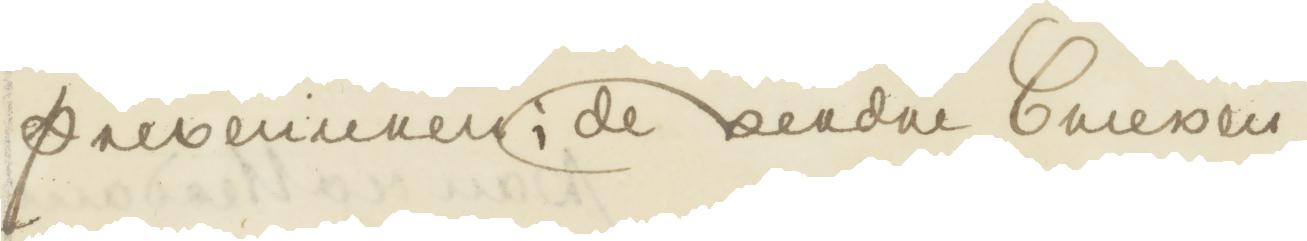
prevenieren; de verdre brieven
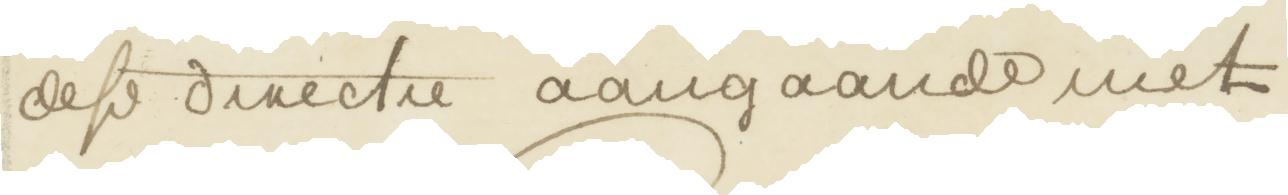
dese directie aangaande met
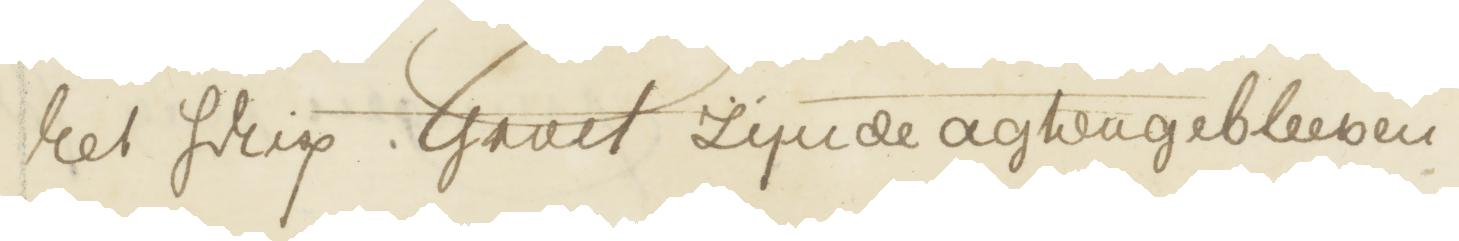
het schip Groet zijnde agtergebleeven
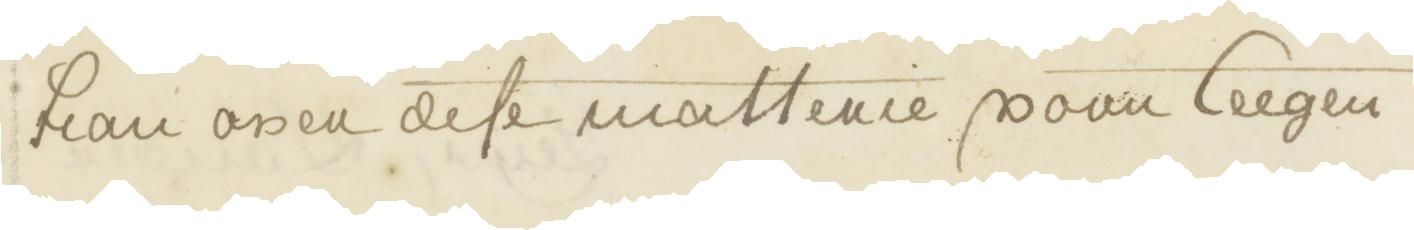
kan over dese matterie voor teegen
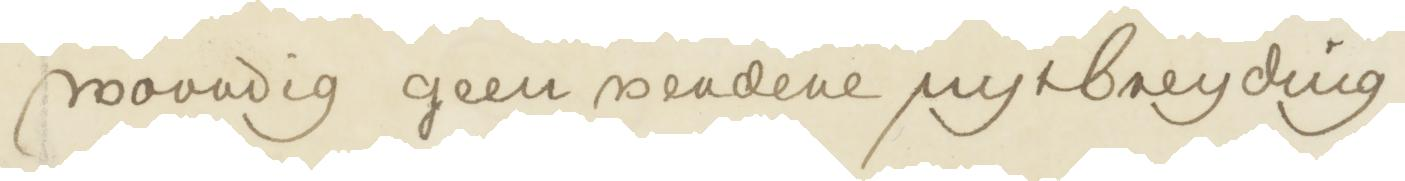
woordig geen verdere uytbreyding
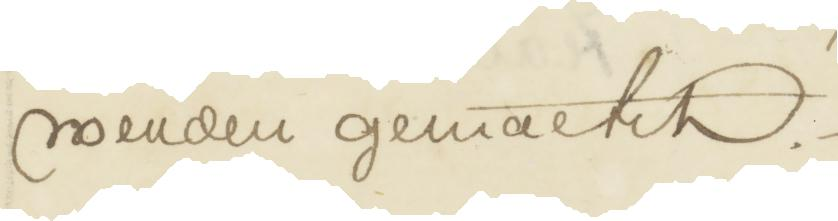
werden gemaekt. —
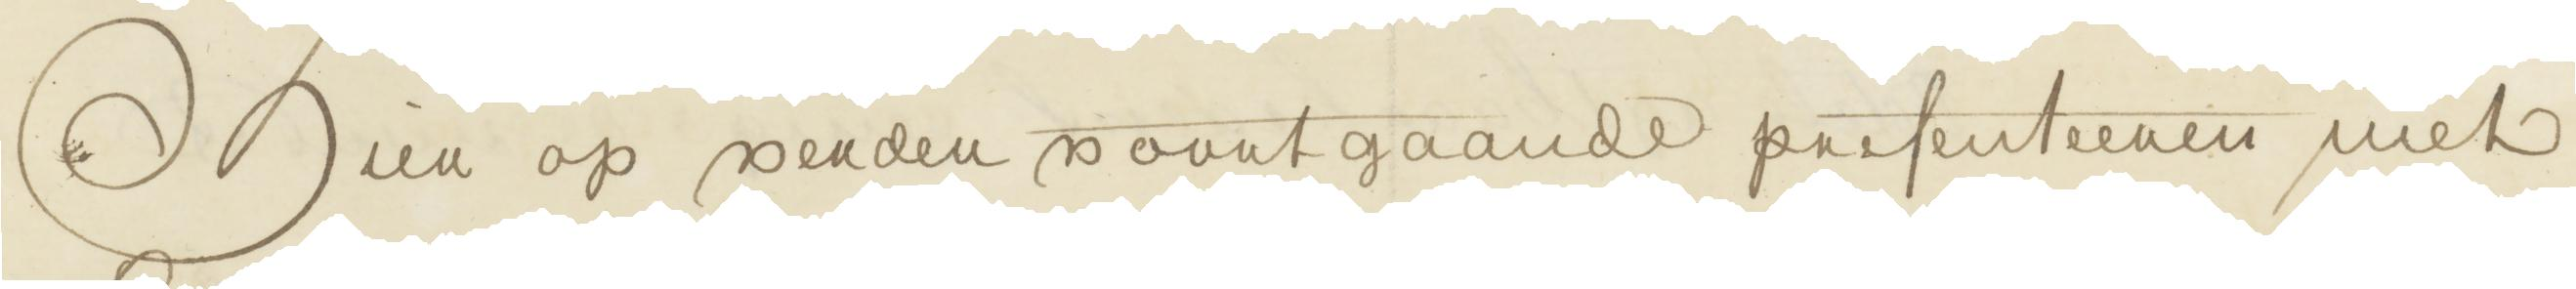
Hier op verder voortgaande presenteeren met
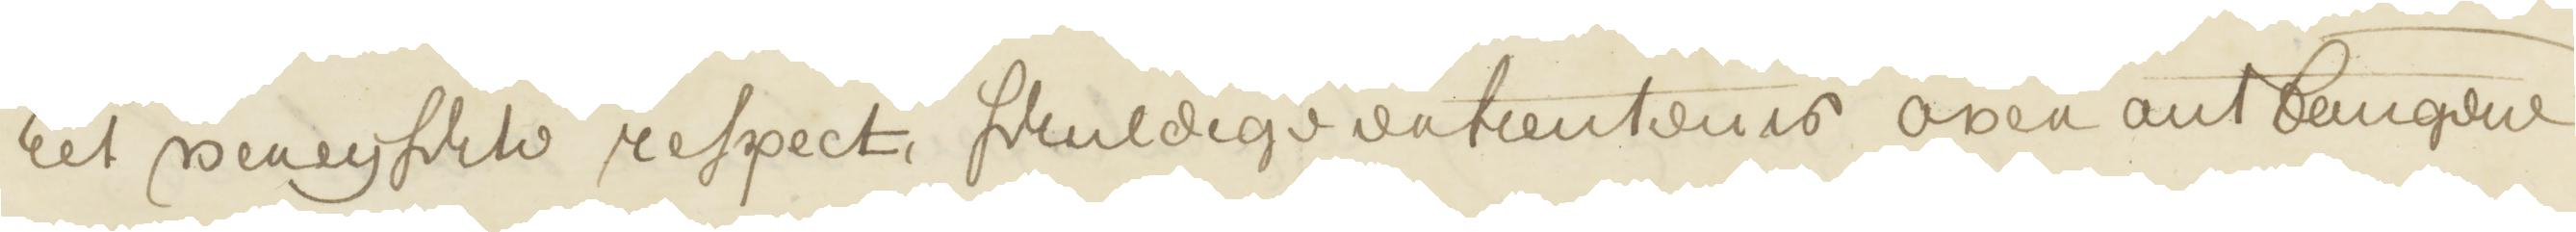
het vereyschte respect, schuldige erkentenis over antfangene
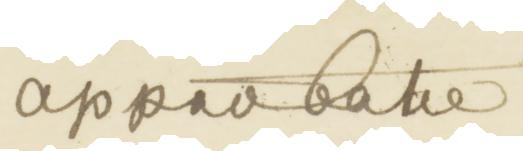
approbatie
